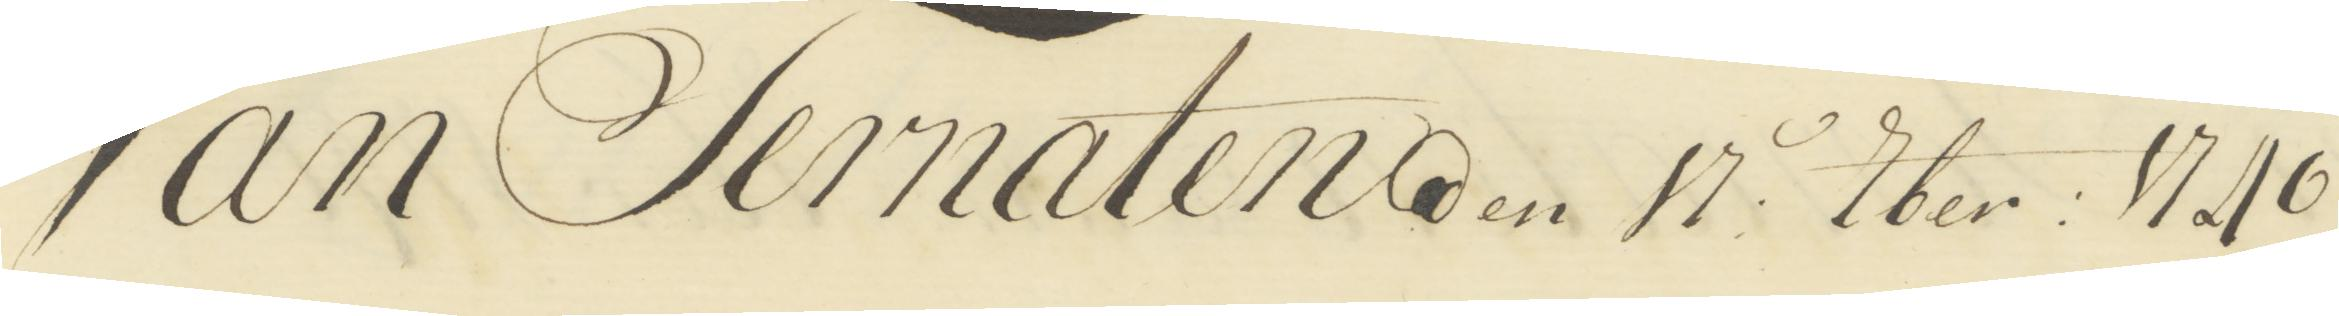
Van Ternaten den 17:' 7ber: 1740
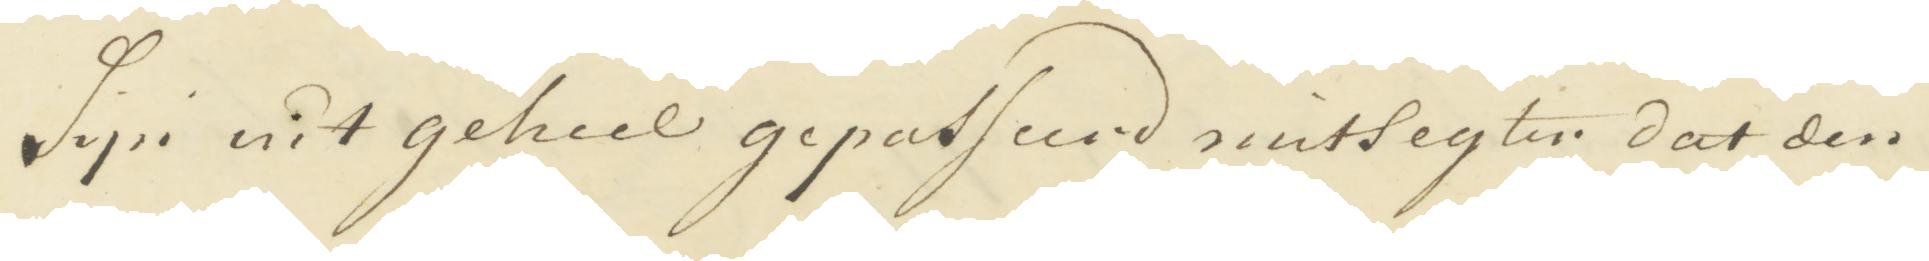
sijn in't geheel gepasseerd mits egter dat den
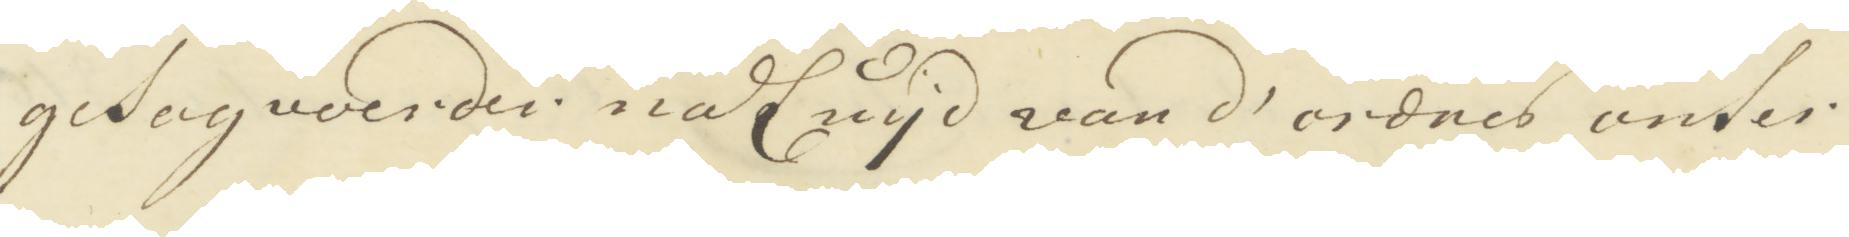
gesagvoerder naluijd van d’ ordres onser
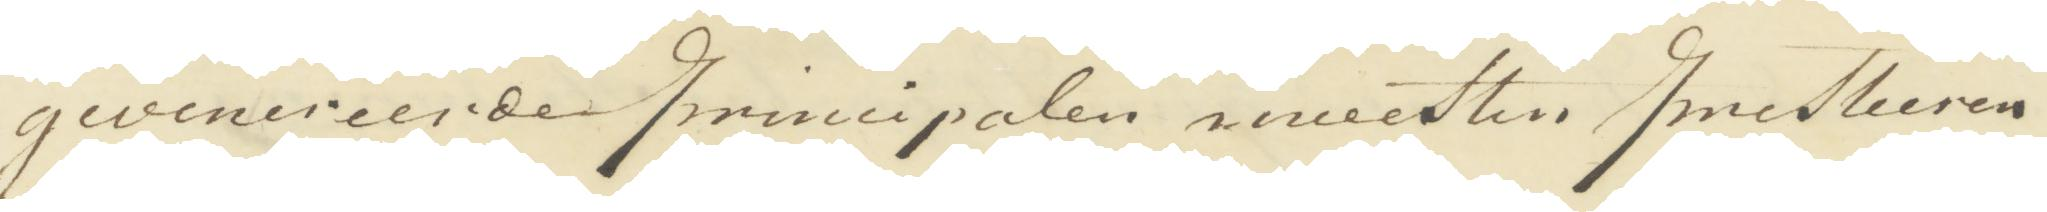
gevenereerde principalen moesten presteeren
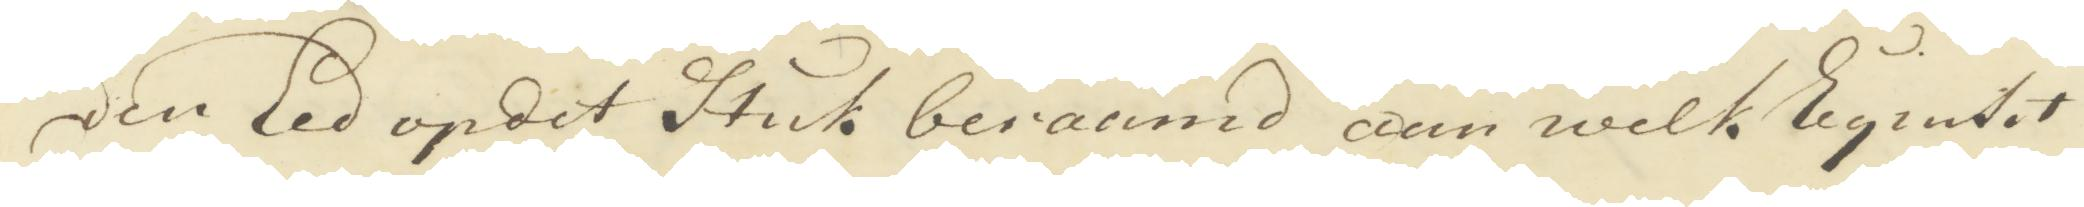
den Eed op dit stuk beraamd aan welk requisit
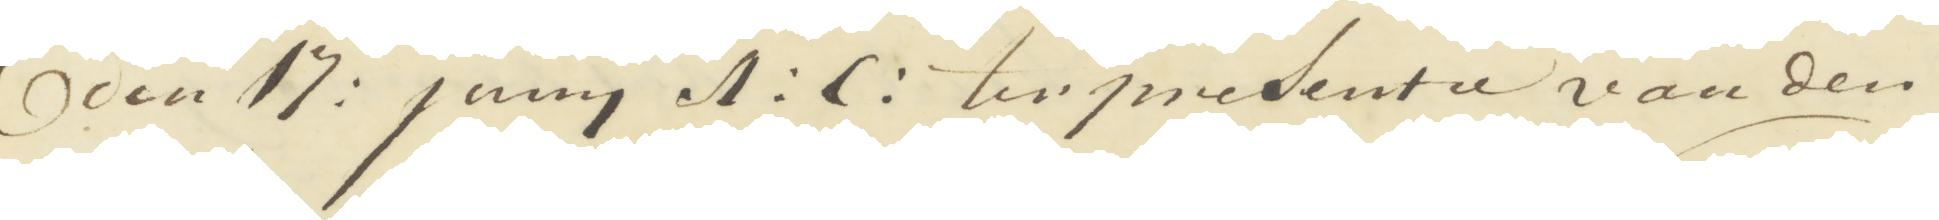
den 17:' Junij A: C: ter presentie van den
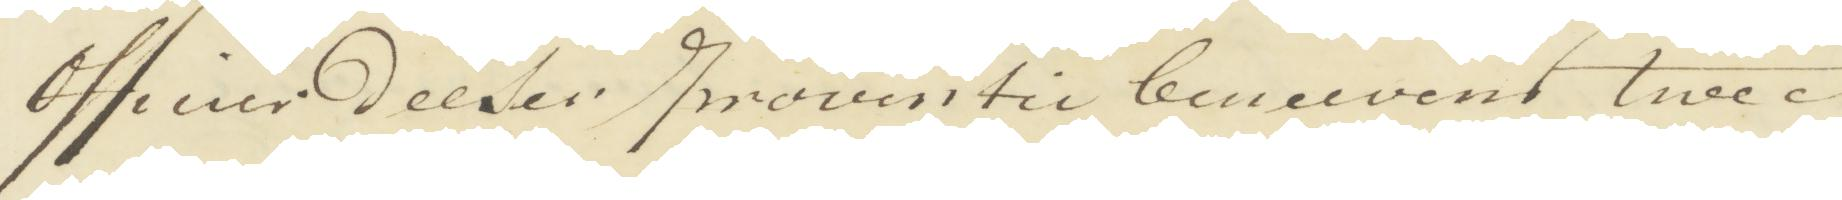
Officier deeser provintie beneevens twee
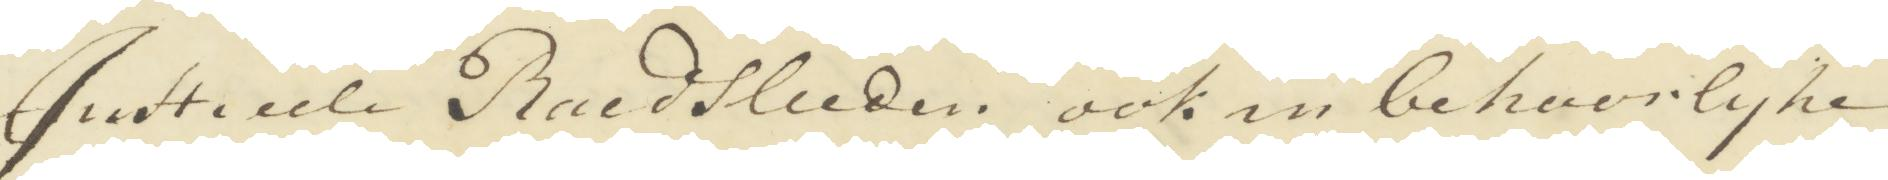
Justieele Raedsleeden ook in behoorlijke
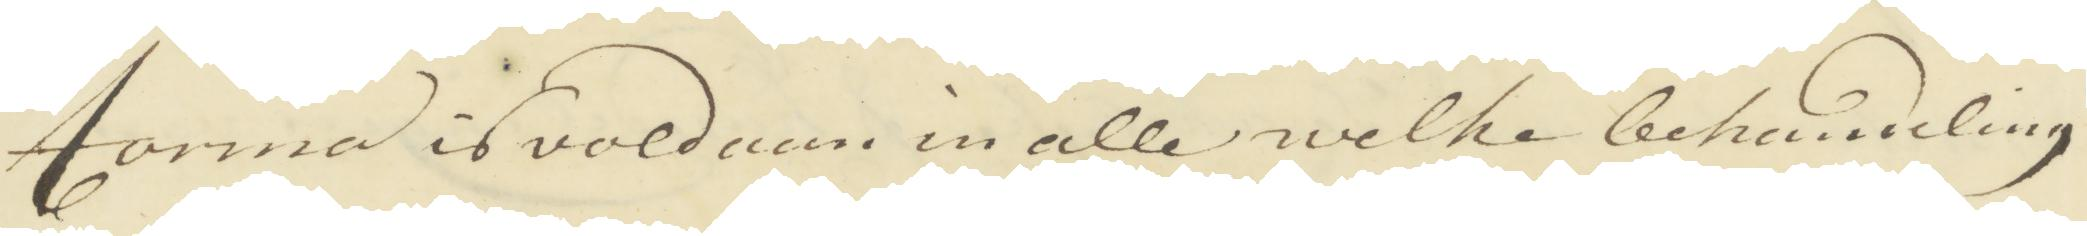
Forma is voldaan in alle welke behandeling
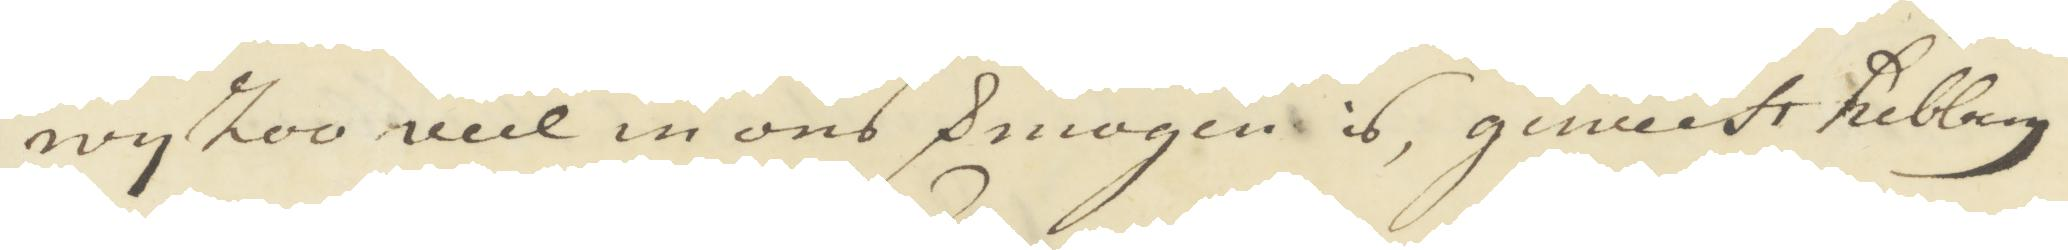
wij zoo veel in ons vermogen is, geweest hebben
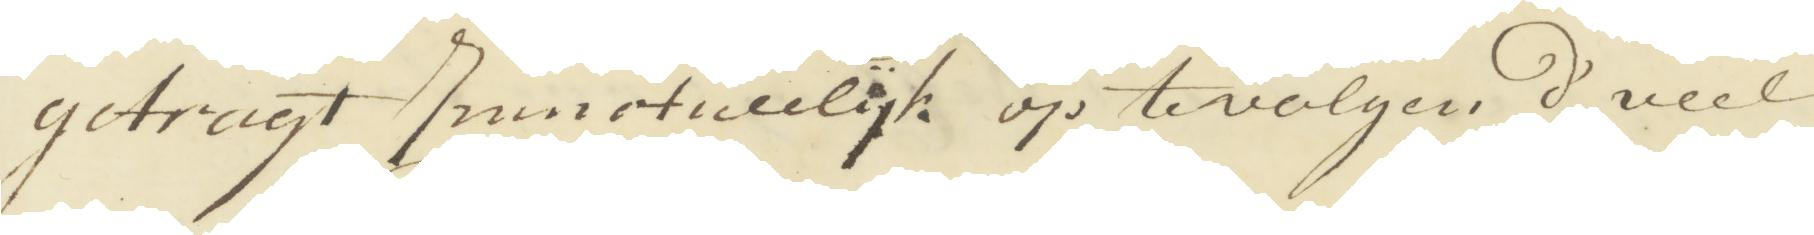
getragt punctueelijk op te volgen d’ veel
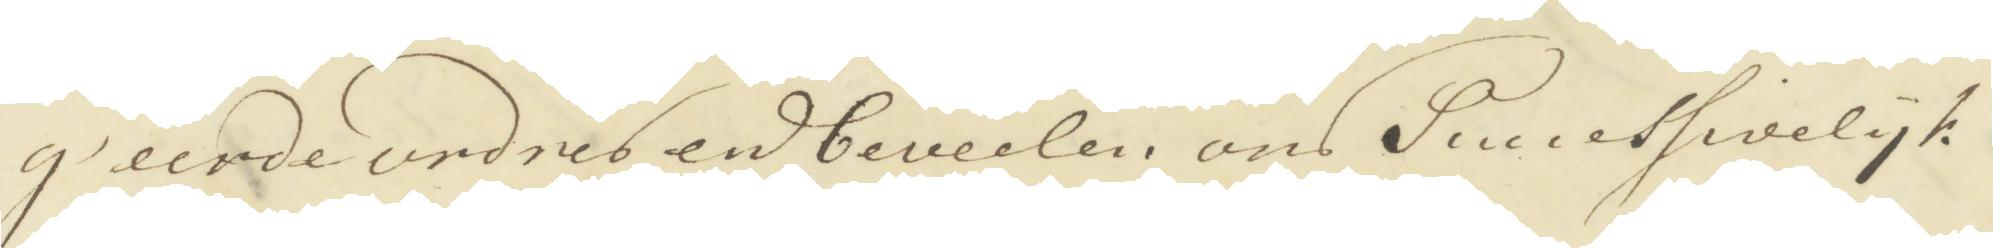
g’eerde ordres en beveelen ons successivelijk
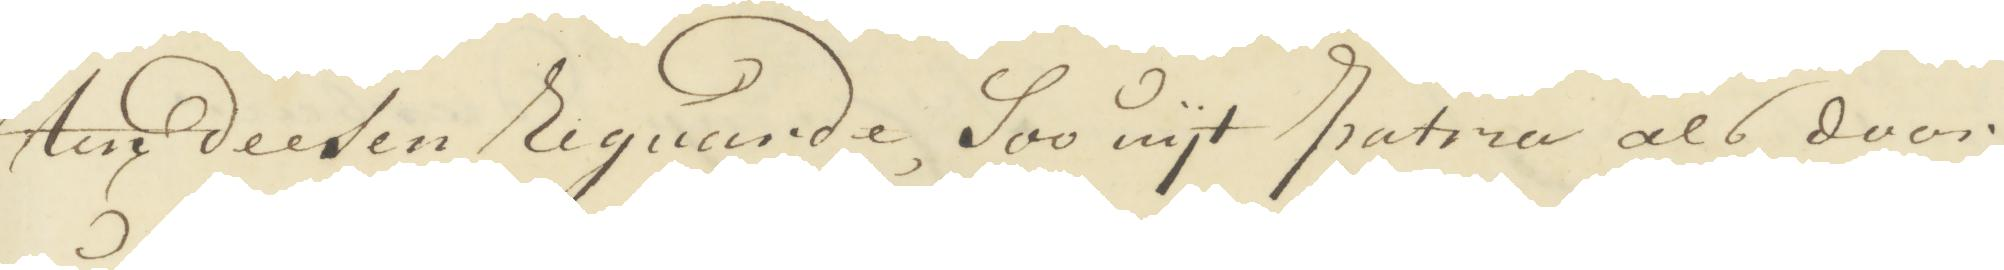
ten deesen Reguarde, soo uijt patria als door
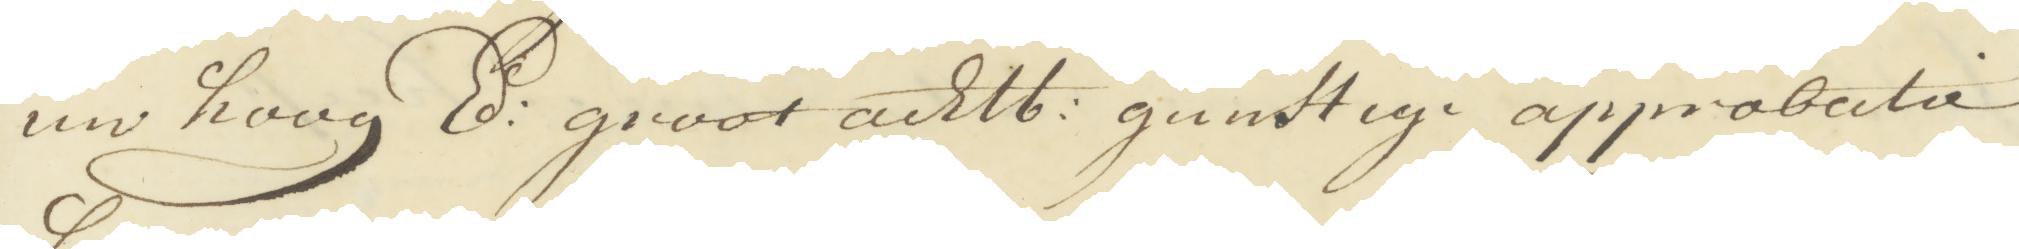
uw hoog Ed: groot achtb: gunstige approbatie
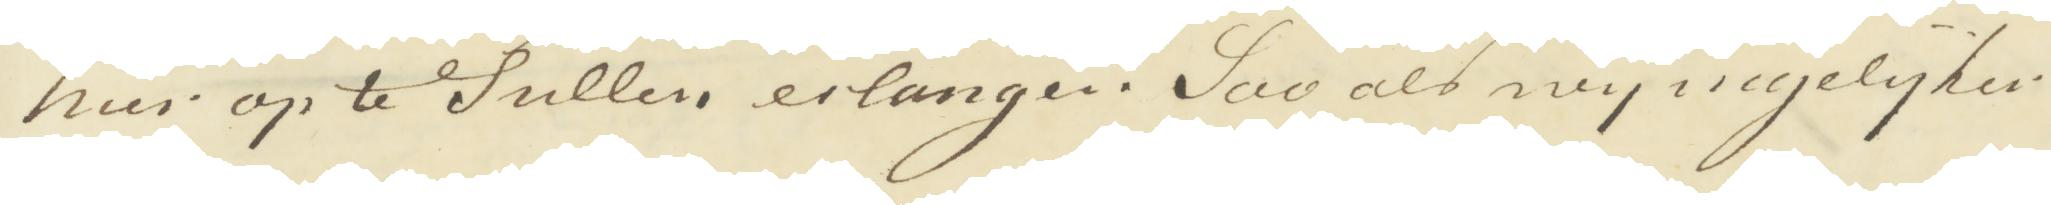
hier op te sullen erlangen soo als wijnigelijker
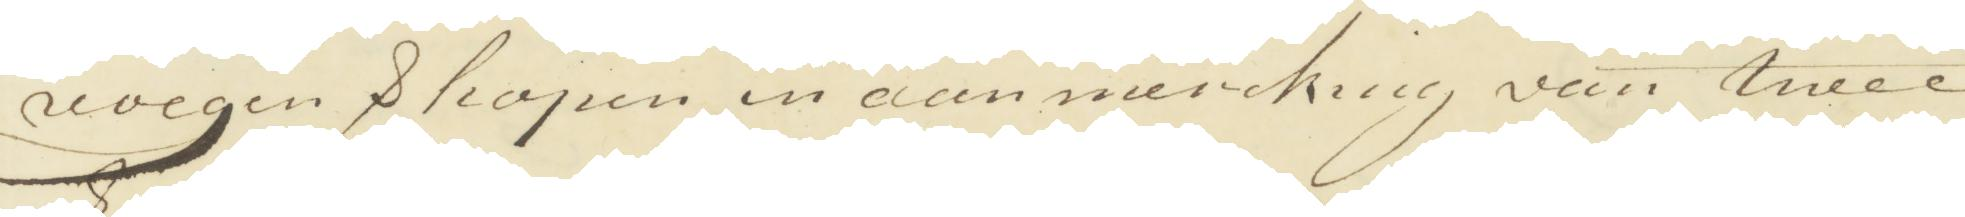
voegen verhopen in aanmerking van twee
